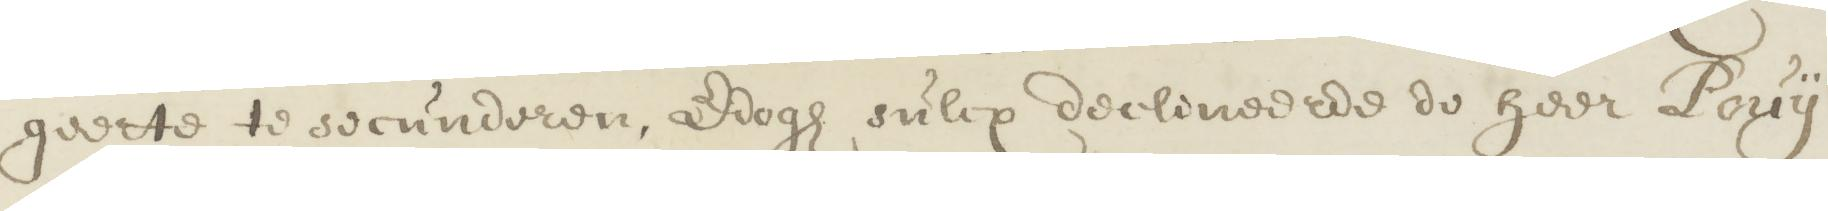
geerte te secunderen, Edogh sulcx declineerde de heer Pouij
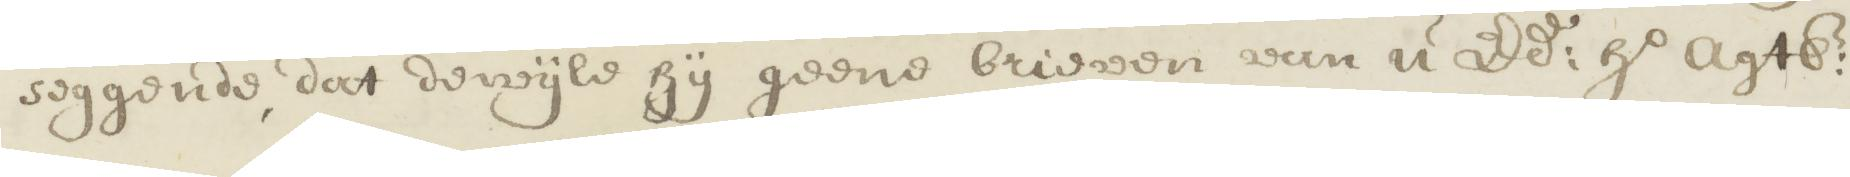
seggende, dat dewijle hij geene brieven van u Ed:e ho Agtb:
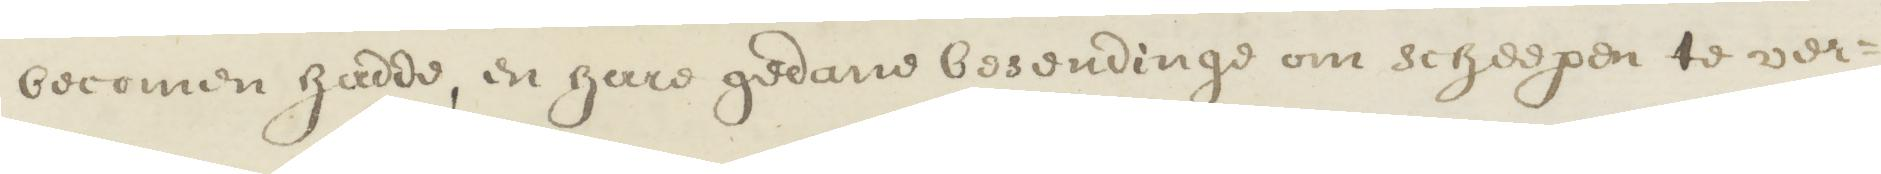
becomen hadde, en hare gedane besendinge om scheepen te ver=
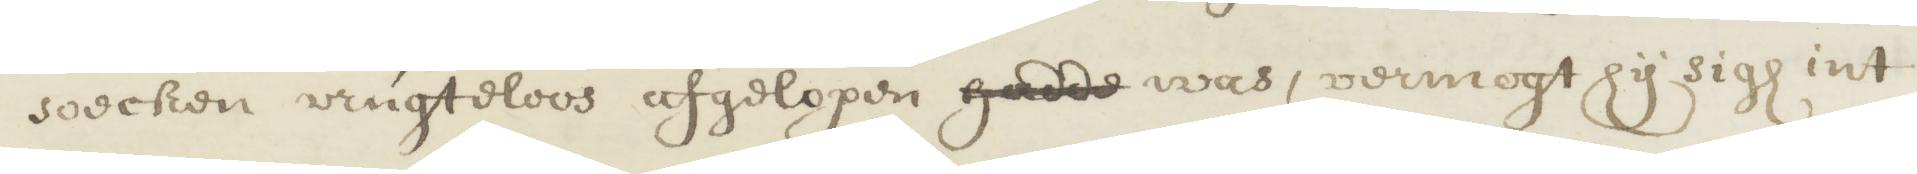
soecken vrugteloos afgelopen hadde was, vermogt hij sigh int
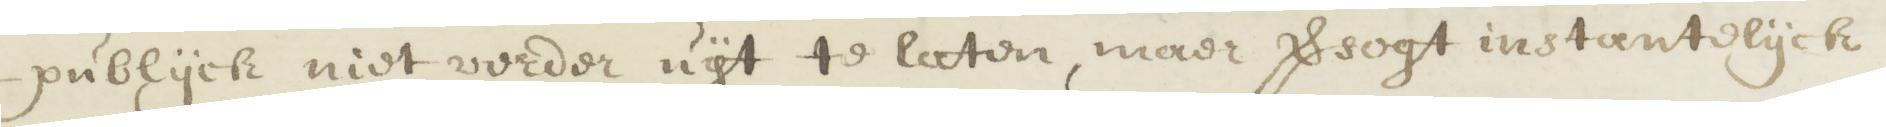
publijck niet verder uijt te laten, maer versogt instantelijck
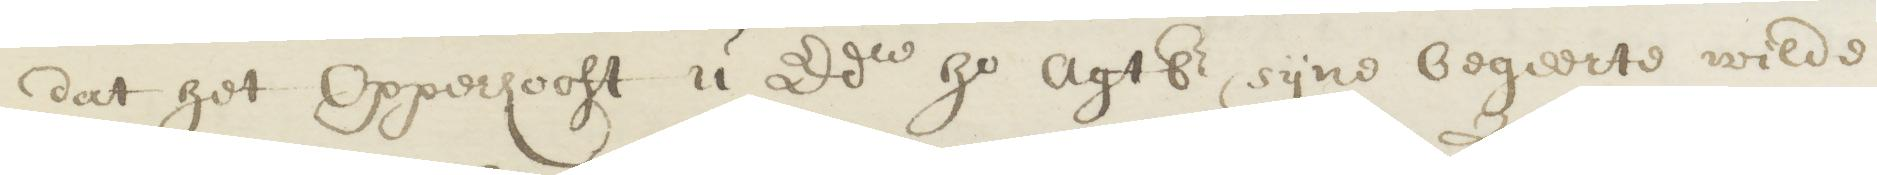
dat het Opperhooft u Edle ho Agtb sijne begeerte wilde
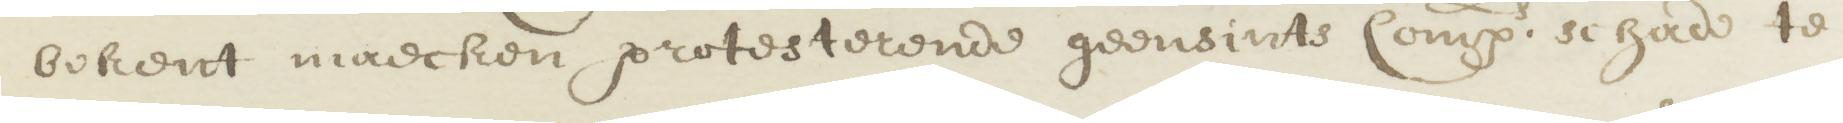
bekent maecken protesterende geensints Comp.s schade te
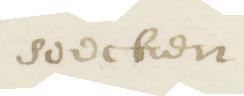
soecken
